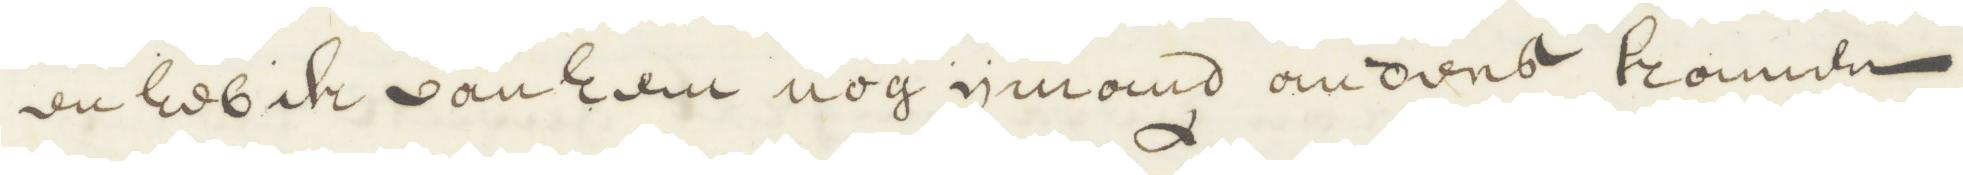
en heb ik van hem nog ijmand anders konnen
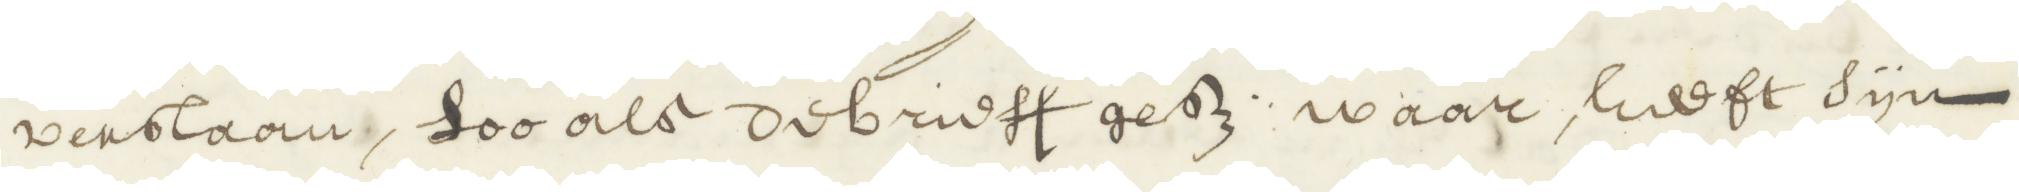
verstaan, soo als debrieff gesz: waar, heeft sijn
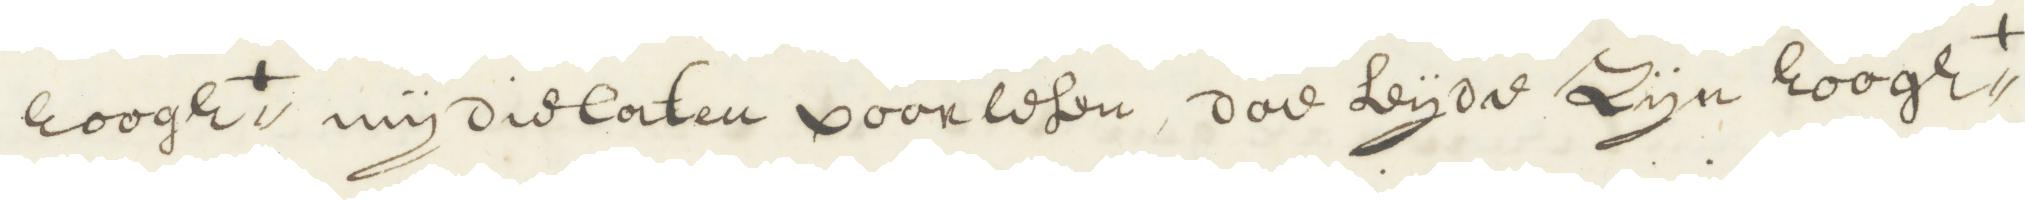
hoogh„t mij dielaten voorlesen, doe seijde zijn hoogh„t
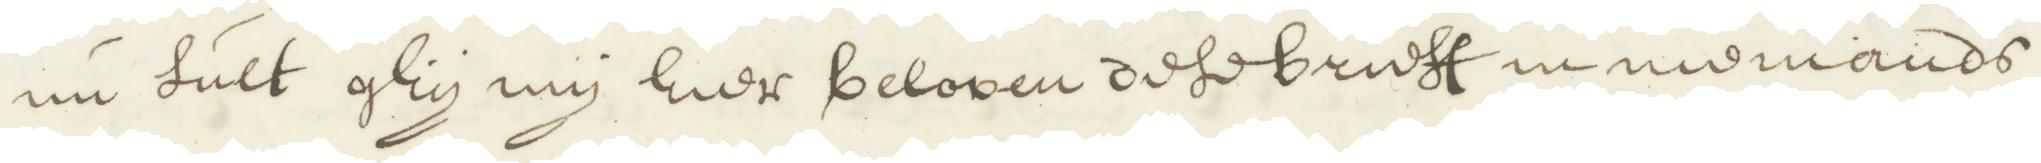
nu sult ghij mij hier beloven dese brieff in niemands
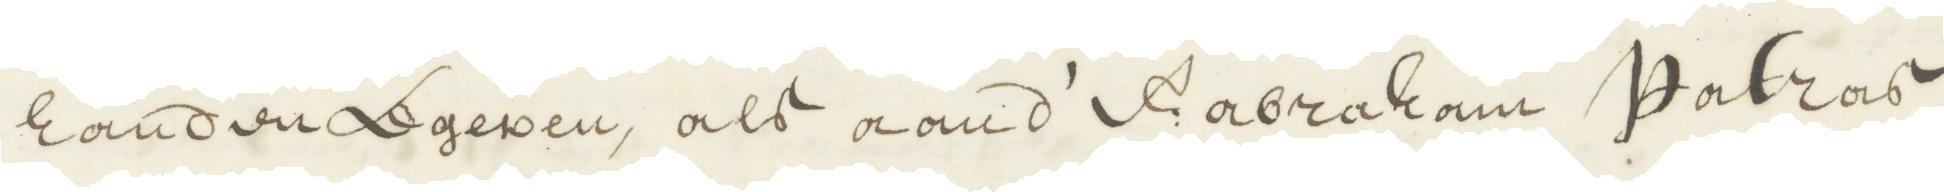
handen te geven, als aan d’ E: abraham Patras
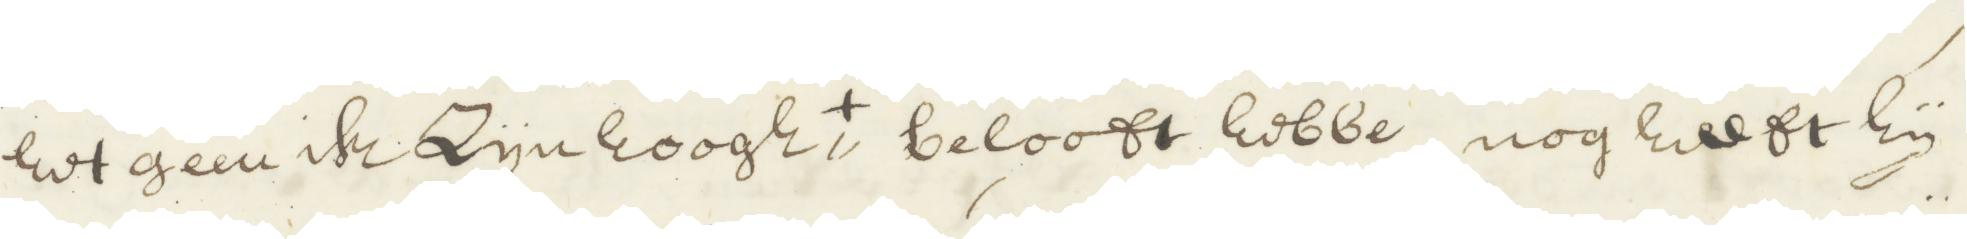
het geen ik zijn hoogh„t belooft hebbe, nog heeft hij
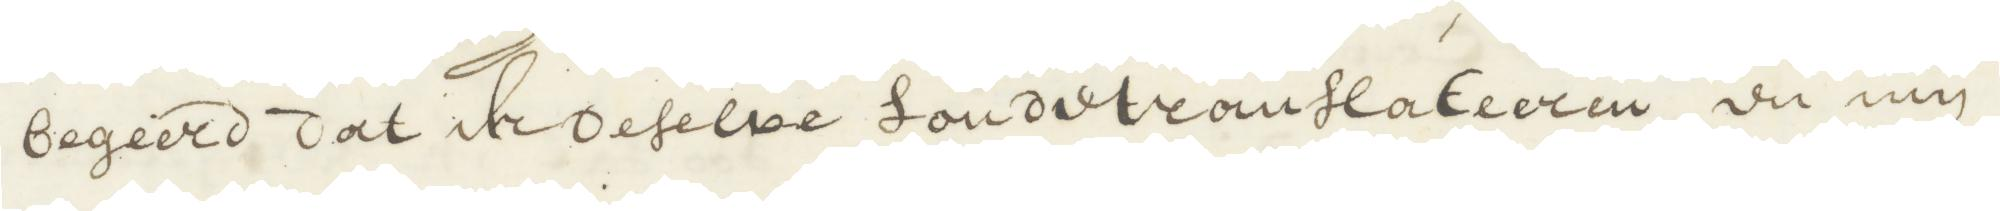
begeerd dat ik deselve soudetranslateeren, en mij
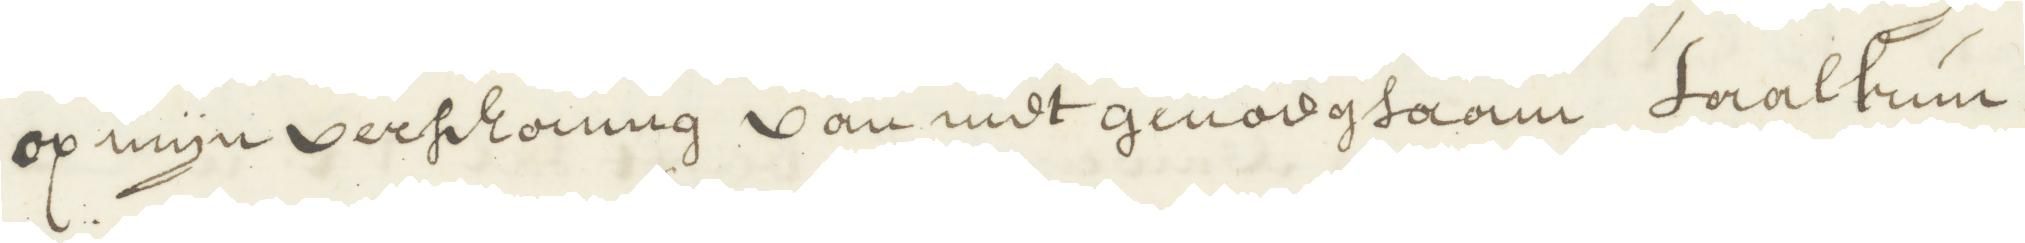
op mijn verschoning van niet genoegsaam taalkun
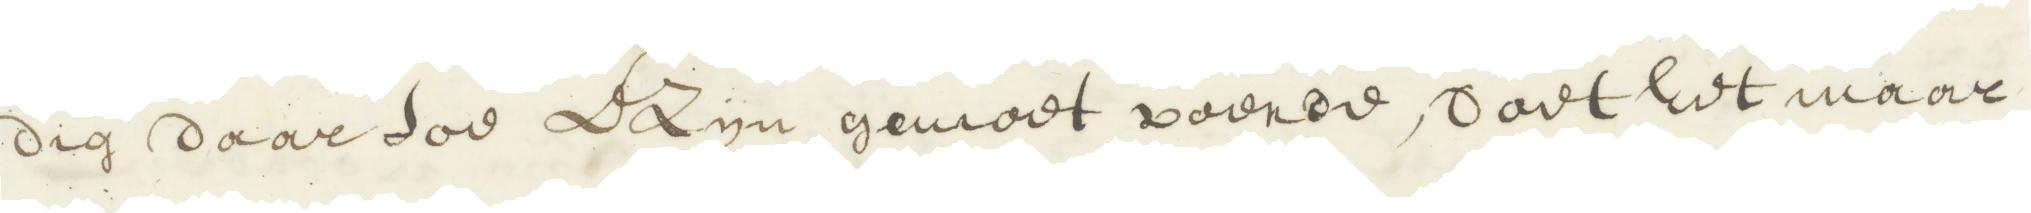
dig daar toe tezijn gemoet voerde, doet het maar
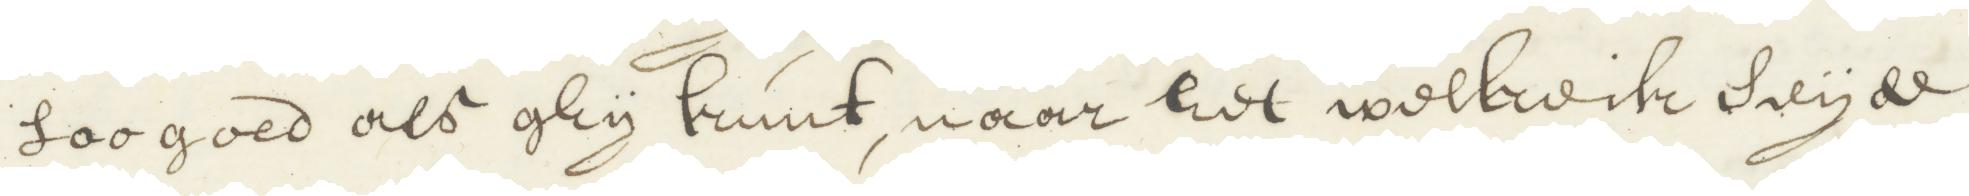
soo goed als ghij kunt, naar het welke ik seijde
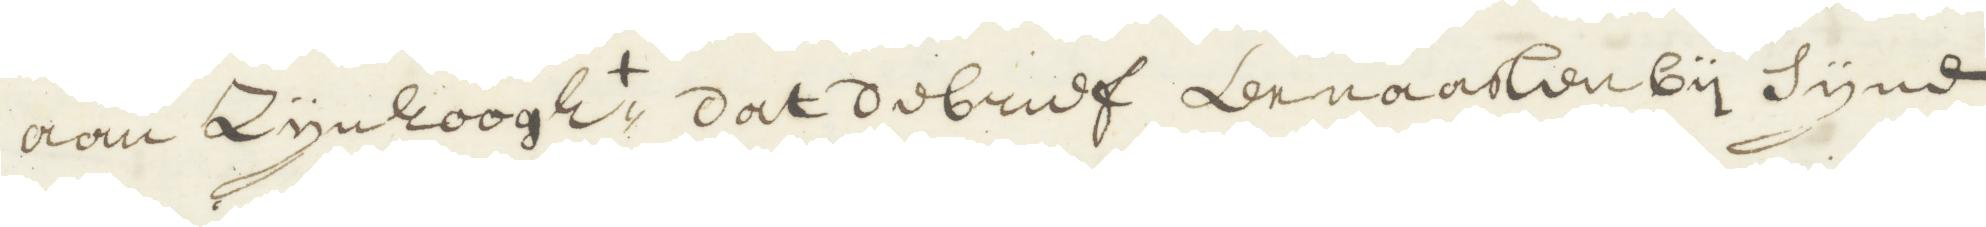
aan zijn hoogh„t dat debrief ter naasten bij sijne
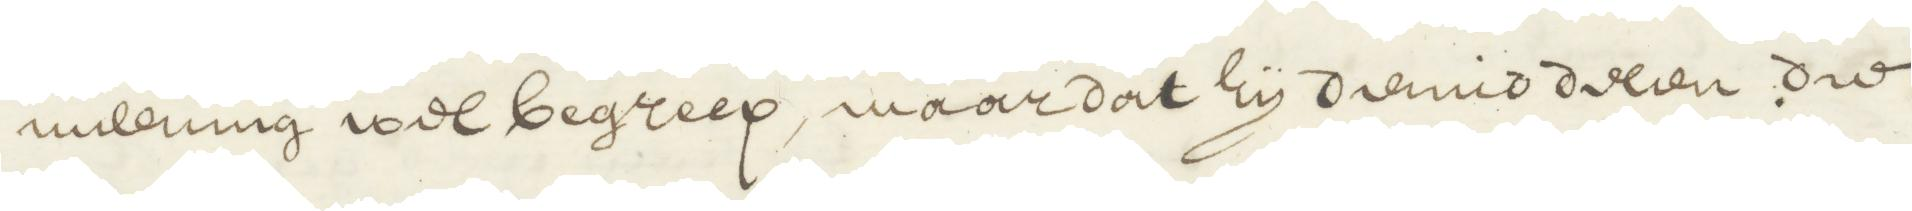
meening wel begreep, maar dat hij demiddelen die
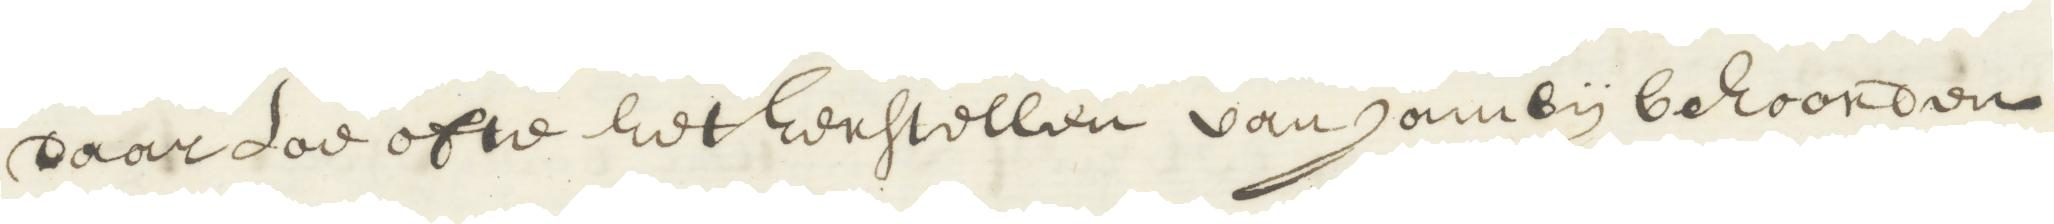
daar toe ofte het herstellen van jambij behoorden
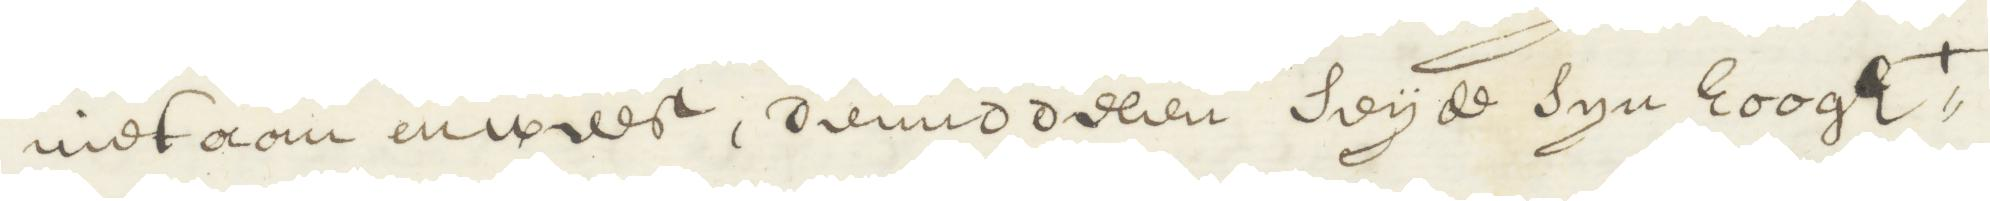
niet aan en wees, demiddelen seijde syn hoogh„t
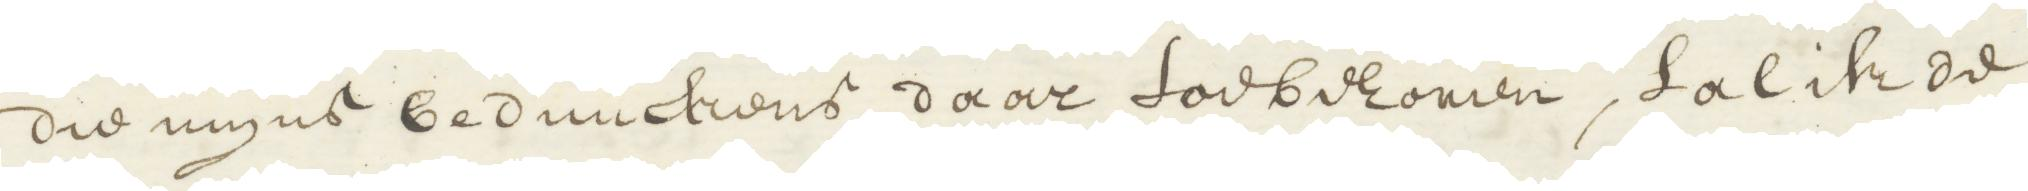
die myns bedunckens daar toebehoren, sal ik de
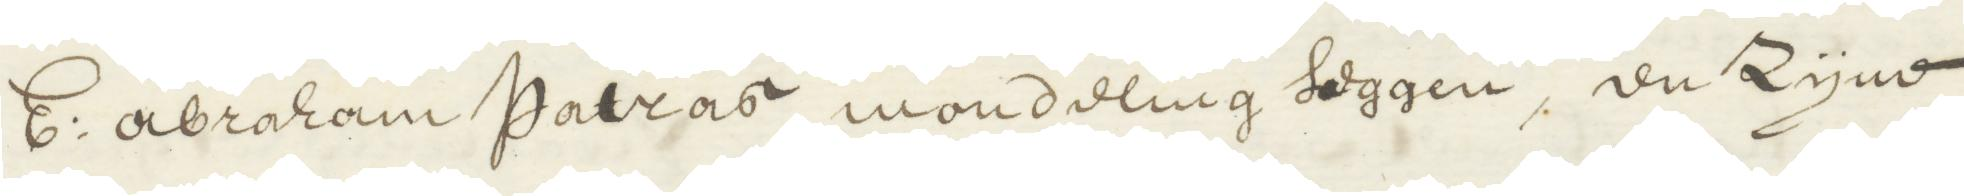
E: abraham Patras mondeling seggen, en zijne
